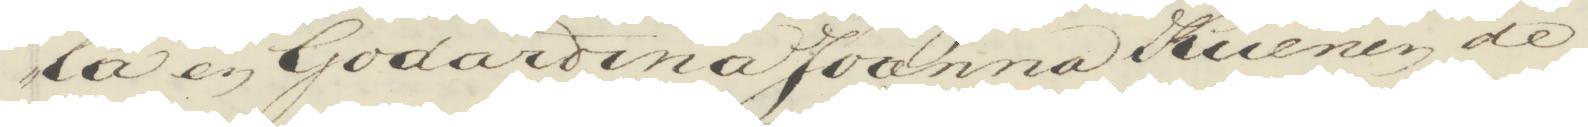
„la en Godardina Joanna Kuenen de
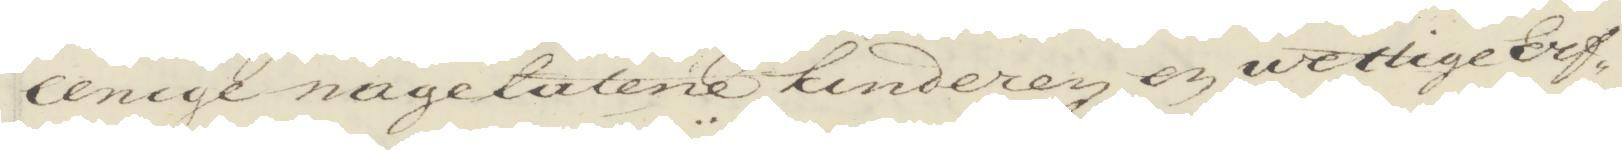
eenige nagelatene kinderen en wettige Erf„
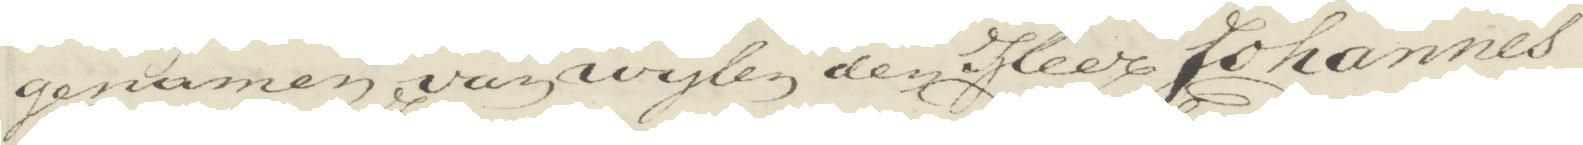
genamen van wijlen den Heer Johannes
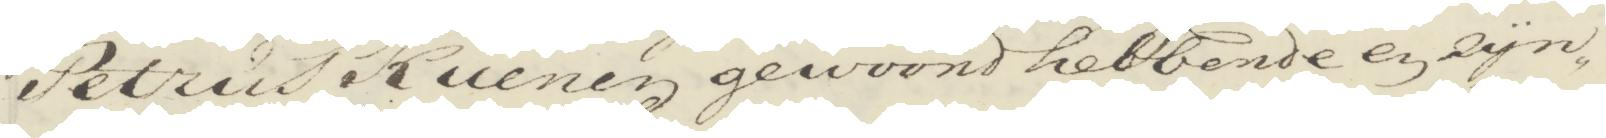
Petrus Kuenen gewoond hebbende en zijn„
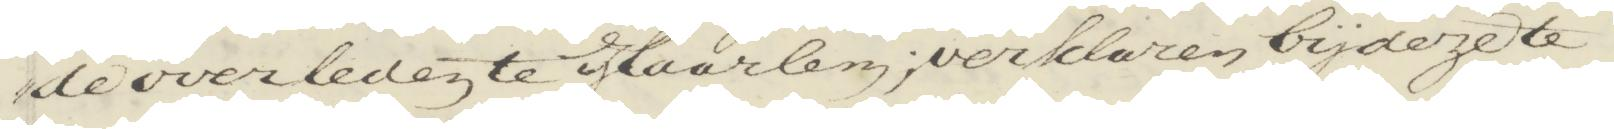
„de overleden te Haarlem, verklaren bij deze te
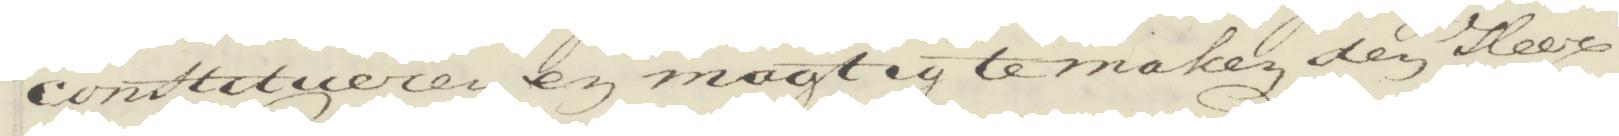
constitueren en magtig te maken den Heer
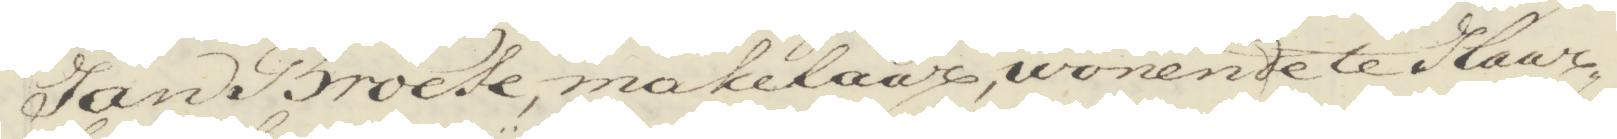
Ian Broese, makelaar, wonende te Haar„
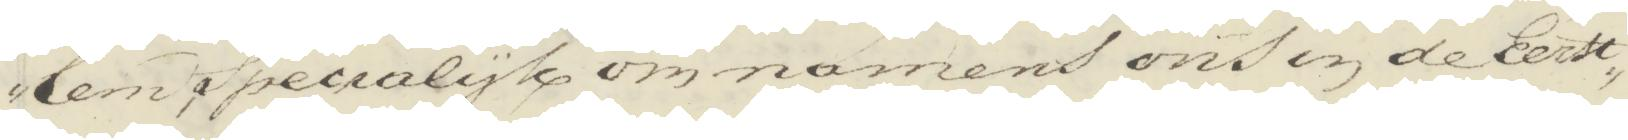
„lem, specialijk om namens ons in de Eerst
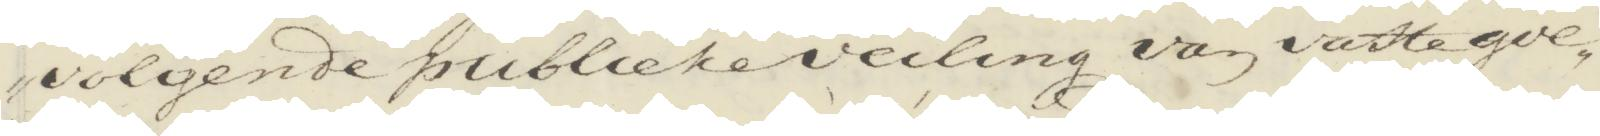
„volgende publieke veiling van vaste goe„
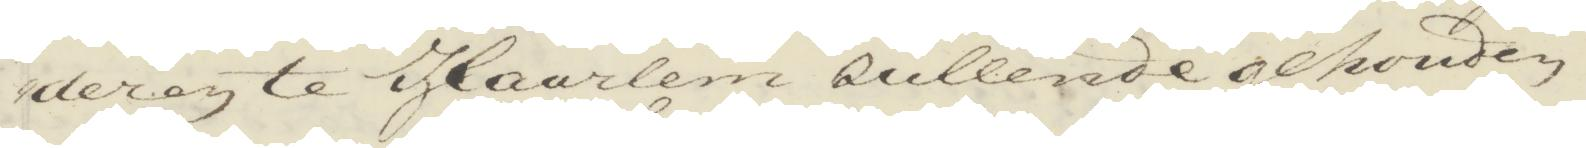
„deren te Haarlem zullende gehouden
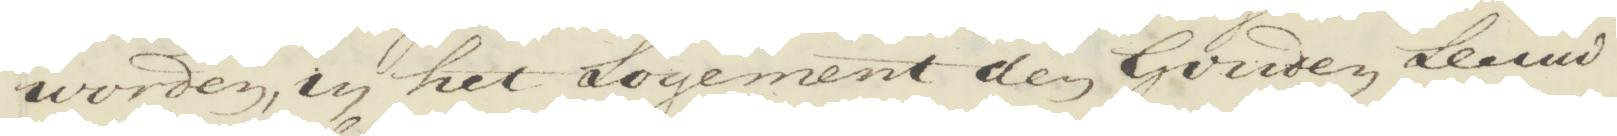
worden, in het Logement den Gouden Leeuw
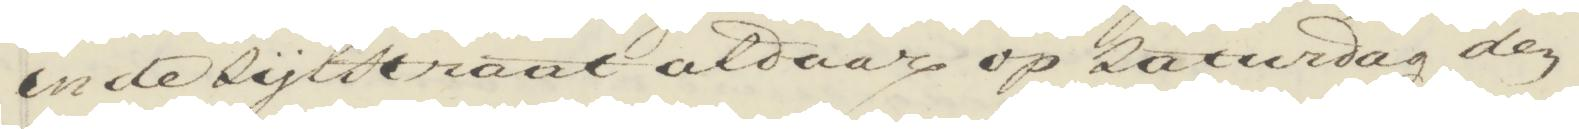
in de Zijlstraat aldaar op zaturdag den
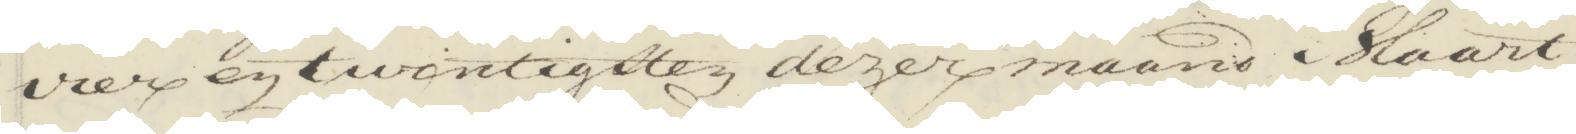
vier en twintigsten dezer maand Maart
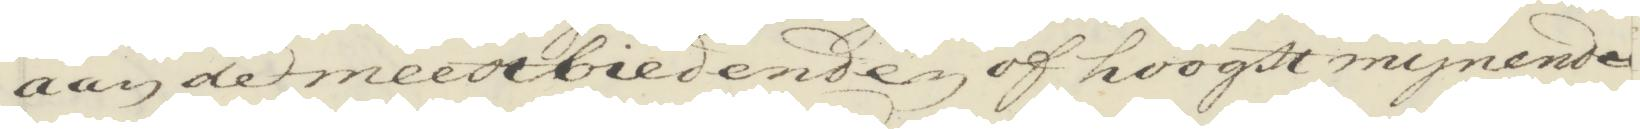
aan de meestbiedenden of hoogst mijnende
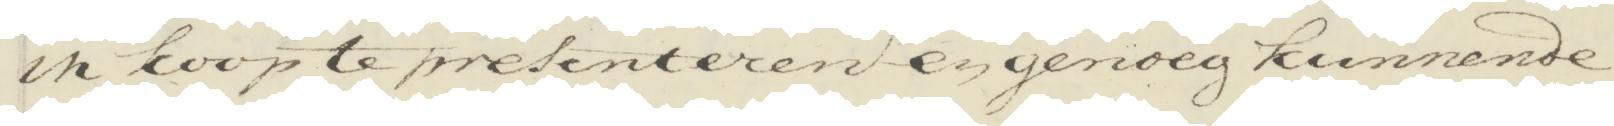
in koop te presenteren en genoeg kunnende
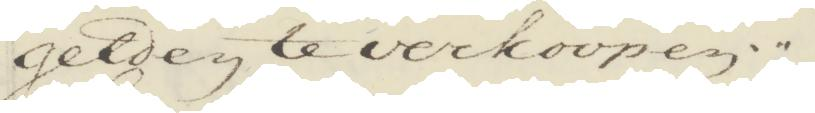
gelden te verkoopen. „
